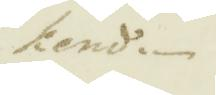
kend.—
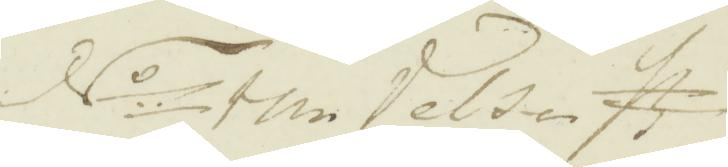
N:o ten Velsen
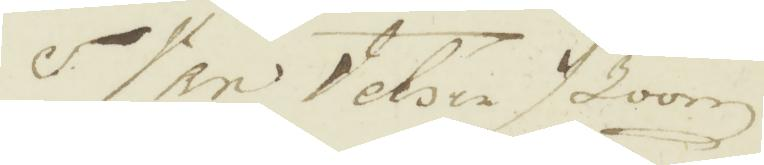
I Van Velden Zoon
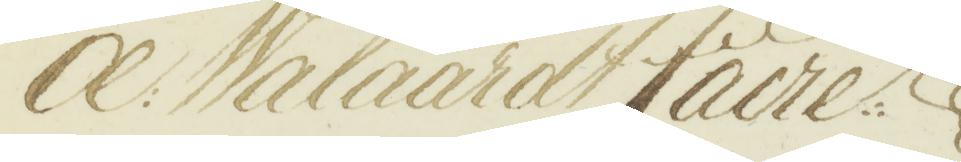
de: Walaardt Sacre
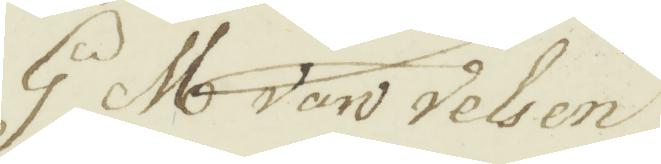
G. M .van Velsen
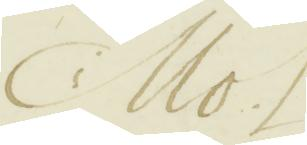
Mo:
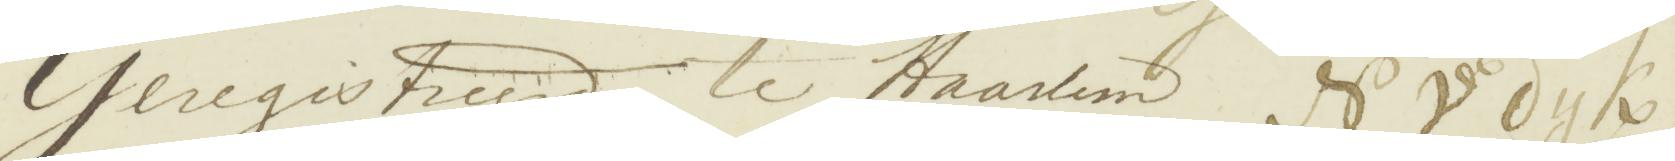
Geregistreerd te Haarlem N V dyk
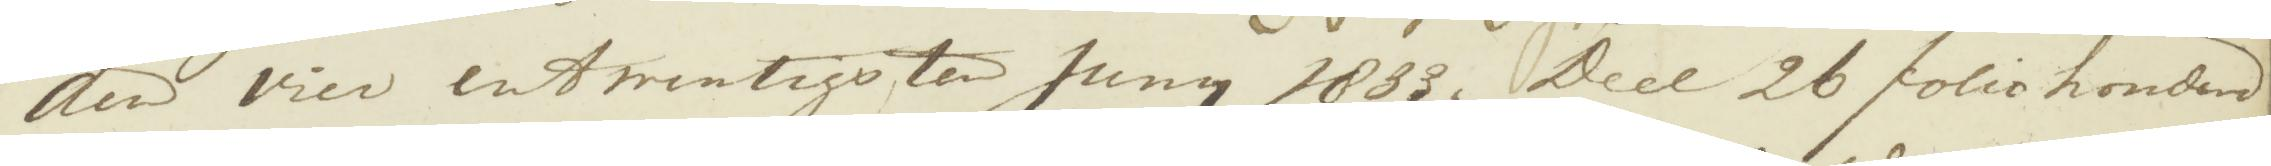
den vier en twintigsten Juny 1833: Deel 26 folio honderd
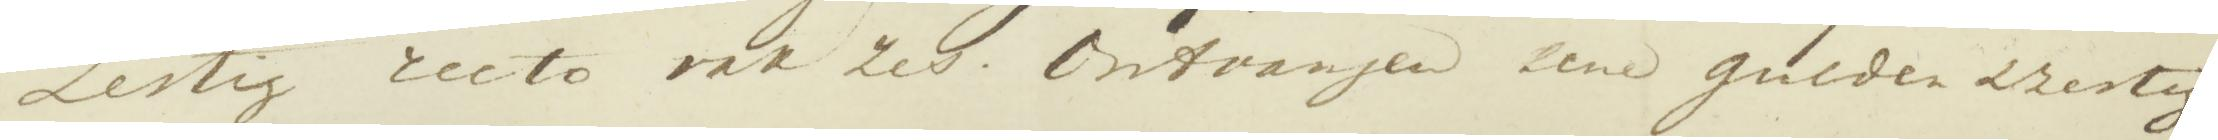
zestig recto vak zes. Ontvangen eene gulden azestig
